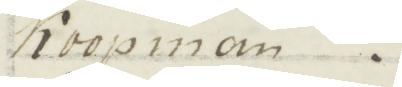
Koopman .
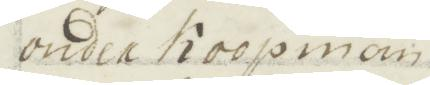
onder Koopman
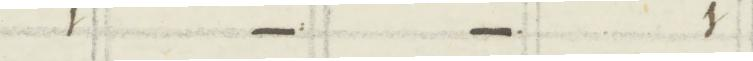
1 —: —. 1
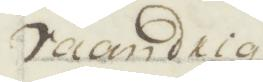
vaandrig „ _o
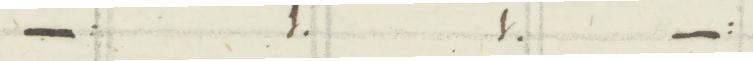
—: 1. 1. —:
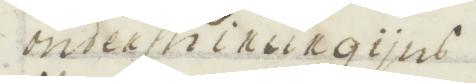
onder Chirurgijns
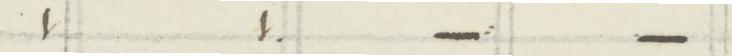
1 1. —: —
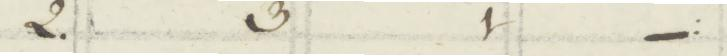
2. 3 1 —:
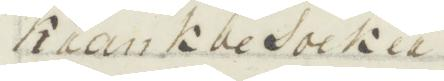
Krank besoeker
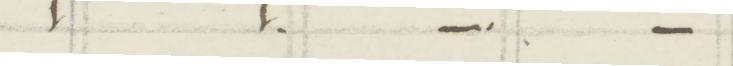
1 1. —. —
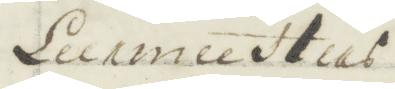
Leermeesters
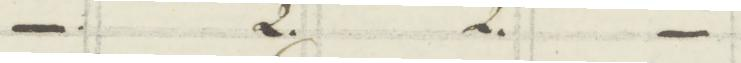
—. 2. 2. —
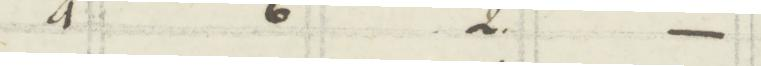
4 6 2. —
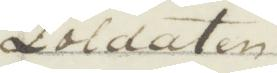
zoldaten
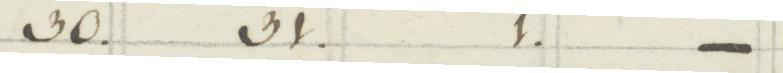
30. 31. 1. —
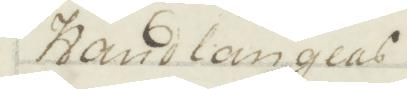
Handlangers
